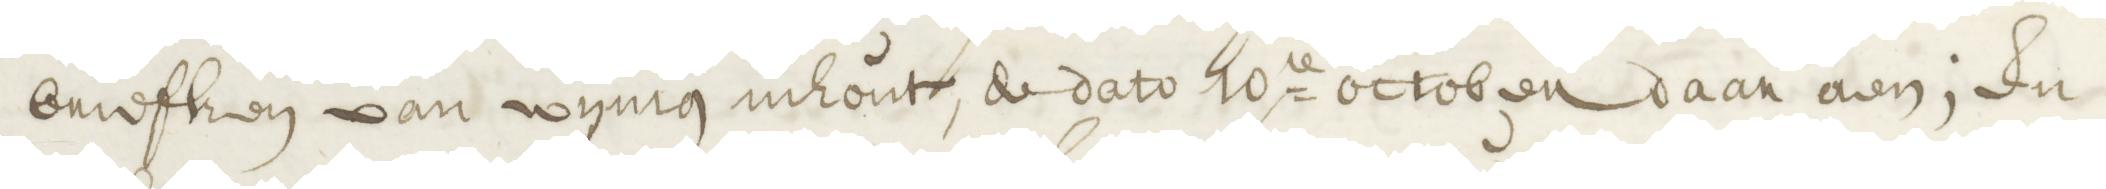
briefken van wijnig inhouts, de dato 10=e october daar aen; En
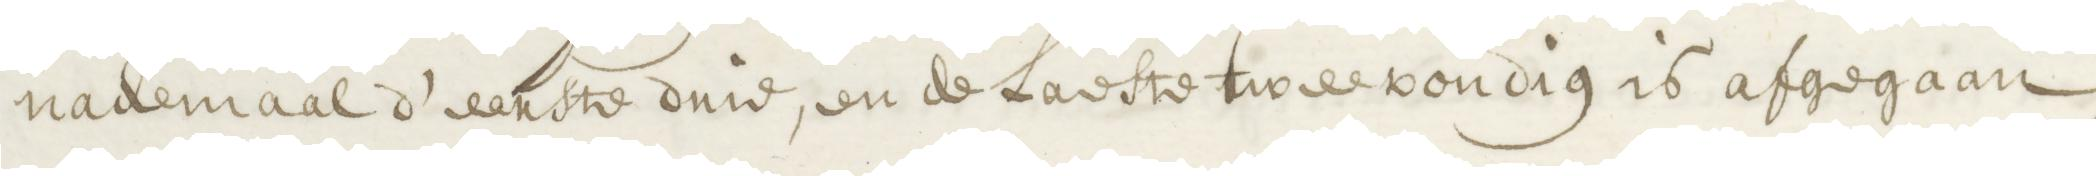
nademaal d’ eerste drie, en de laeste tweevoudig is afgegaan,
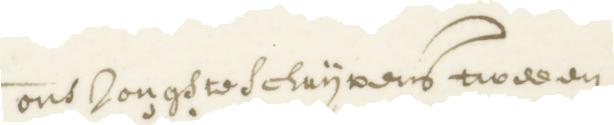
ons Jongste schrijvens twee en
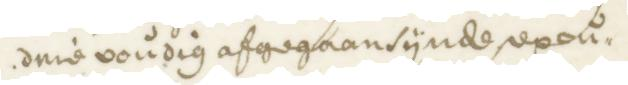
drie voudig afgegaan sijnde exou„
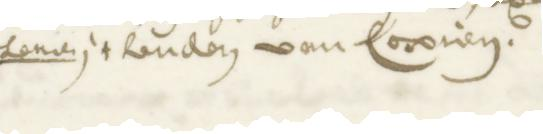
sent, 't senden van Copien.
